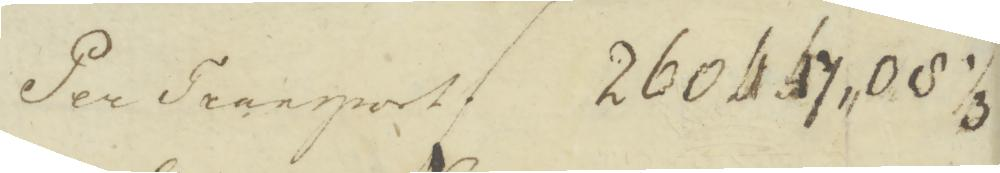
Per Transport ƒ 260447„08 1/3
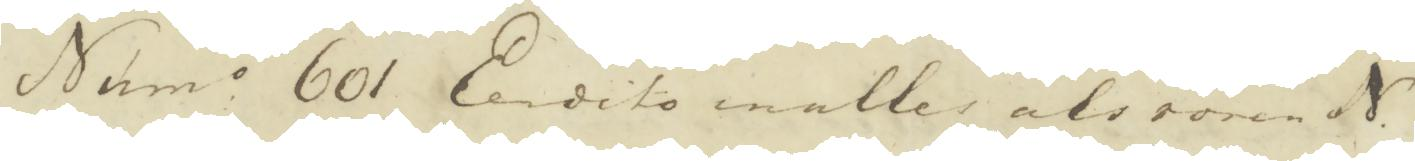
Num:o 601 Een dito in alles als voren N.
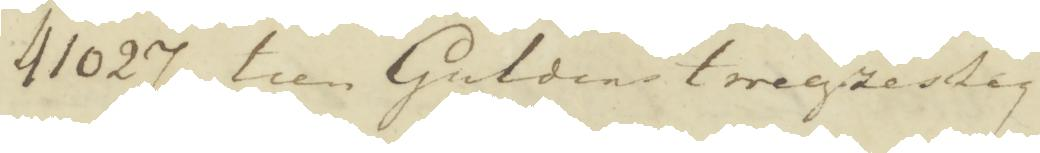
41027. tien Guldens tweeen zestig
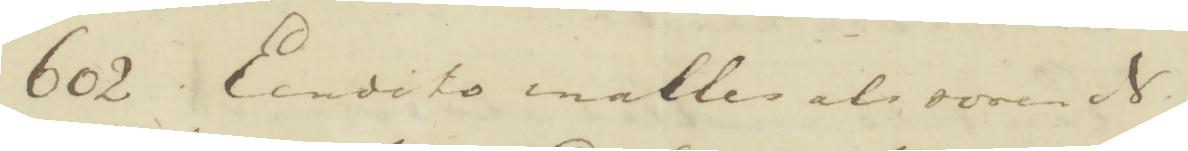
602 Een dito in alles als voren N.
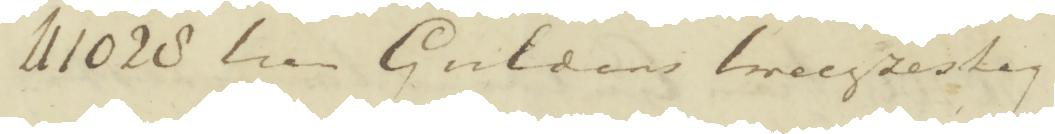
41028 tien Guldens tweeen zestig
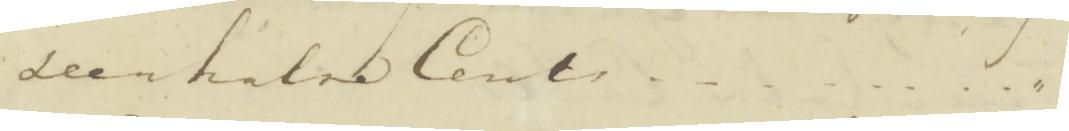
& een halve Cents - - - - - - - - „
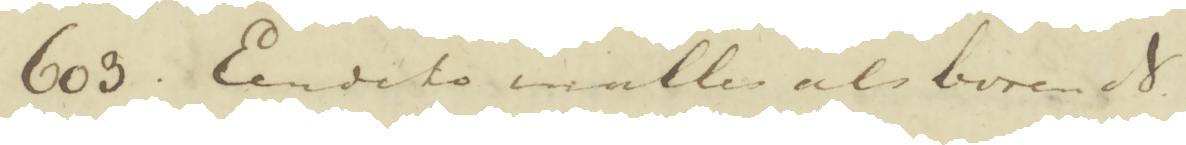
603. Een dito in alles als boven N
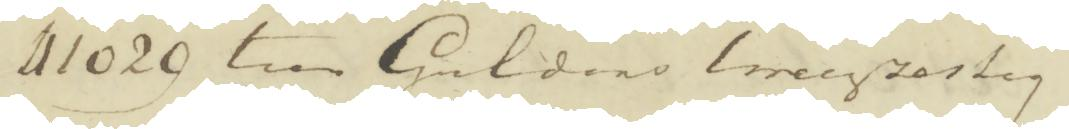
41029 tien Guldens tweeen zestig
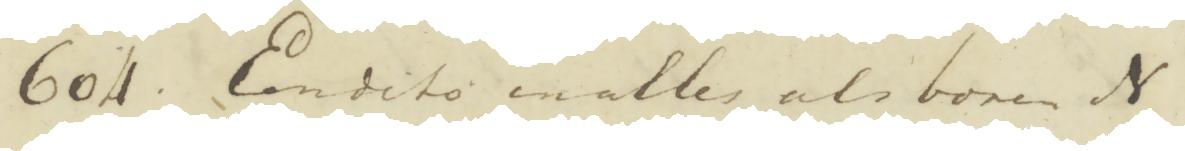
604. Een dito in alles als boven N
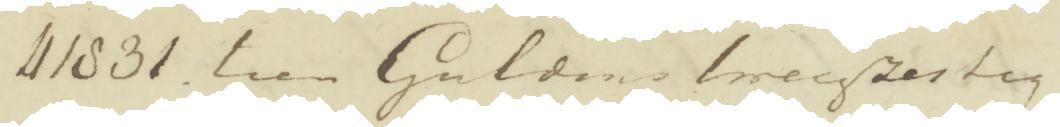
41831 tien Guldens tweeen zestig
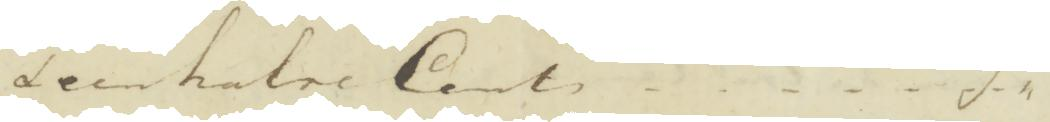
& een halve Cents- - - - - - - „
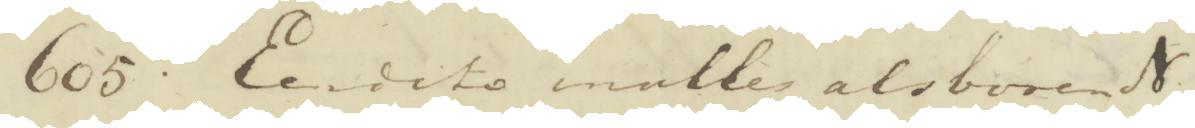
605. Een dito in alles als boven N
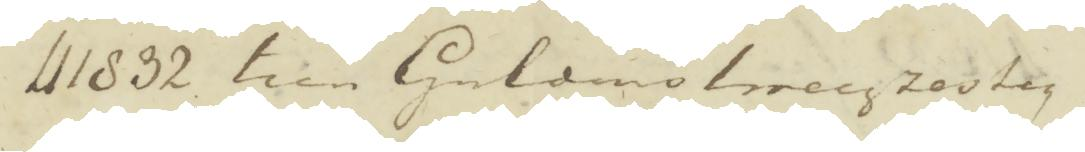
41832 tien Guldens tweeen zestig
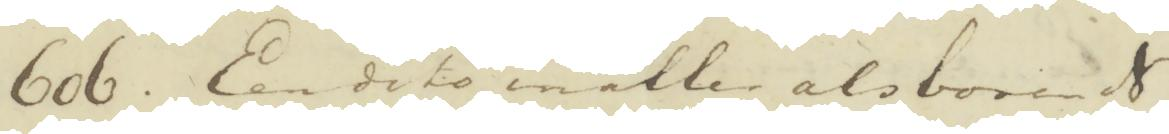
606. Een dito in alles als boven N
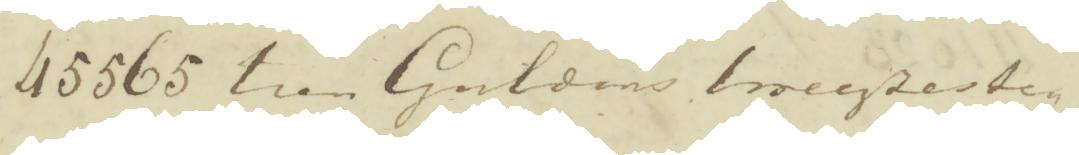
45565 tien Guldens tweeen zestig
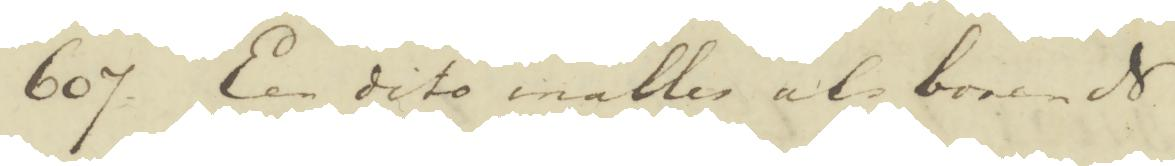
607 Een dito in alles als boven N
